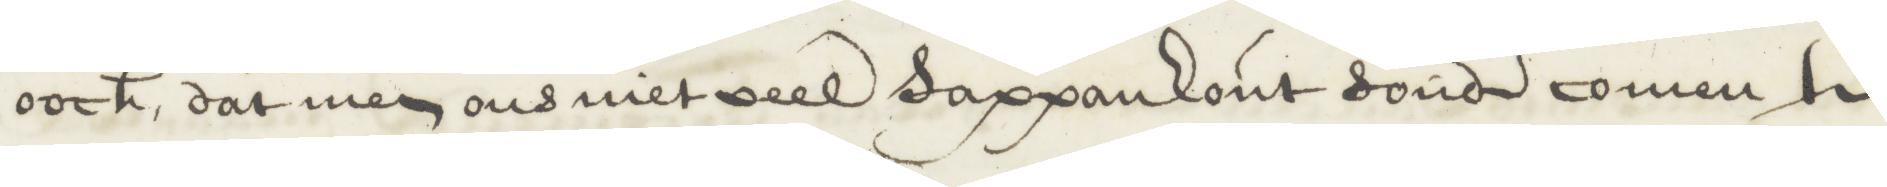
oock, dat men ons niet veel sappanhout soude comen te
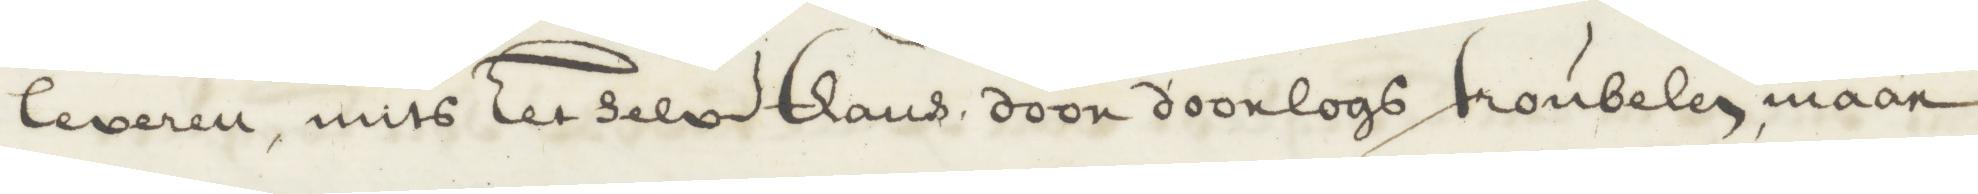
leveren, mits het selve thans, door d'oorlogs troubelen, maar
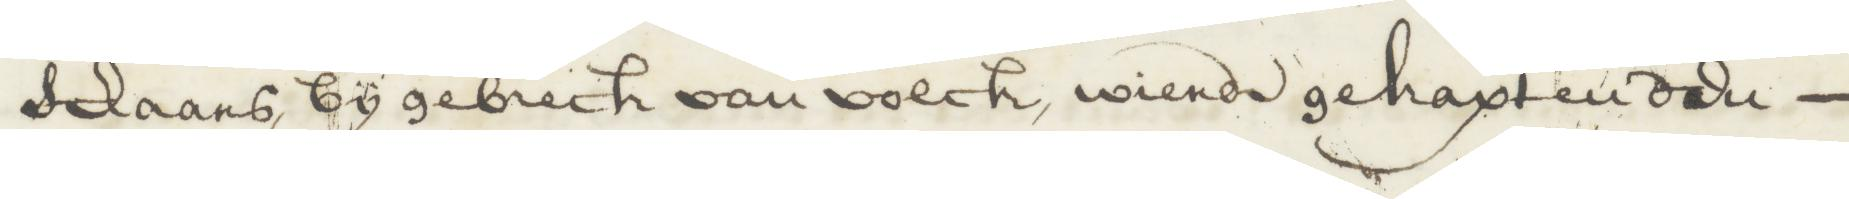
schaars, bij gebreck van volck, wierde gekapt en den
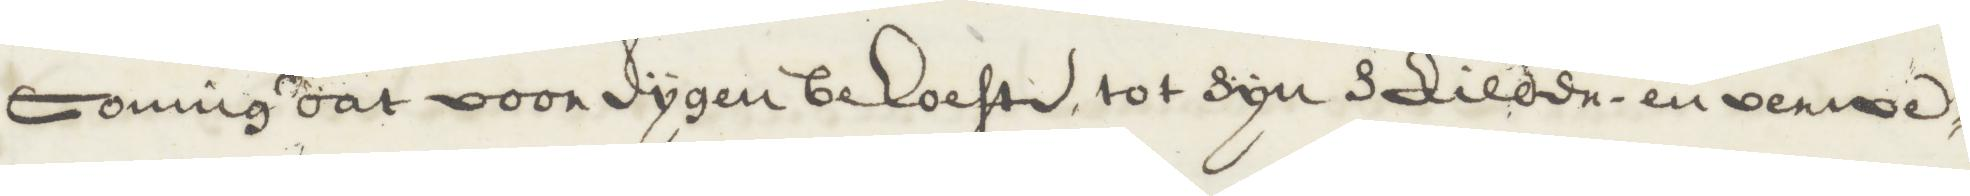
coning dat voor eijgen behoefte, tot sijn schilder- en verwe„
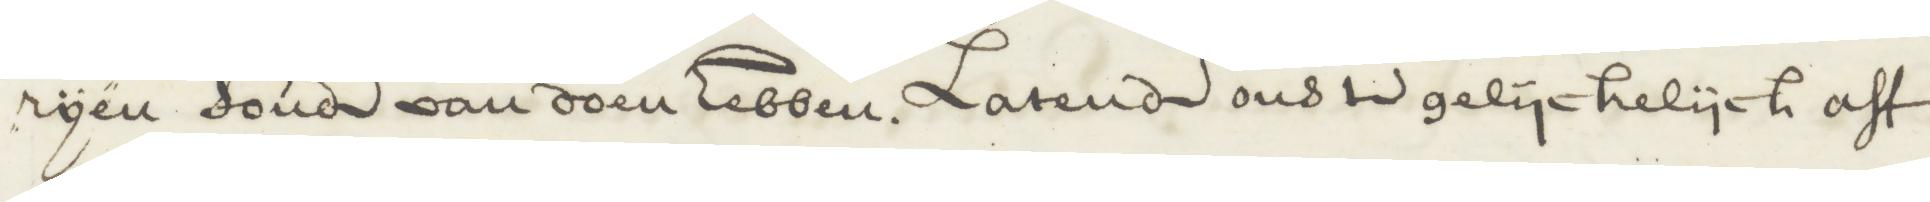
rijen soude van doen hebben. Latende ons te gelijckelijck aff
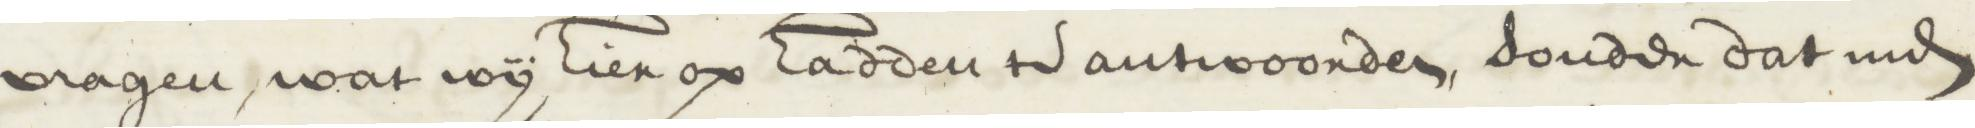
vragen, wat wij hier op hadden te antwoorden, sonder dat men
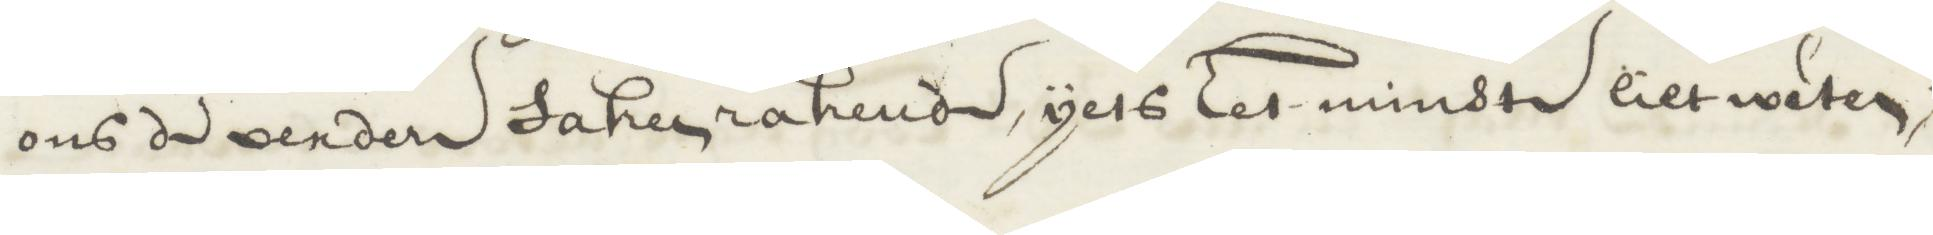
ons de verdere saken rakende, ijets het minste liet weten,
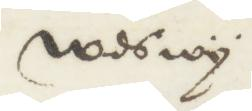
wes wij
